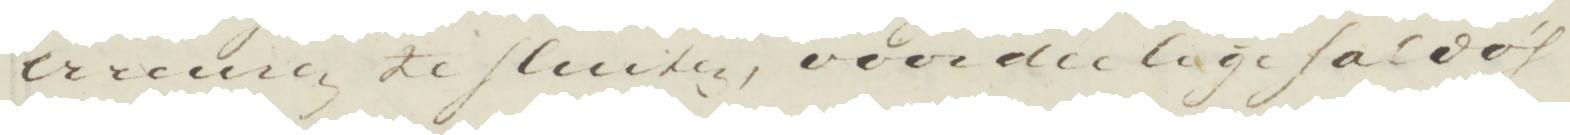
erreuren te sluiten, voor die lage saldo's
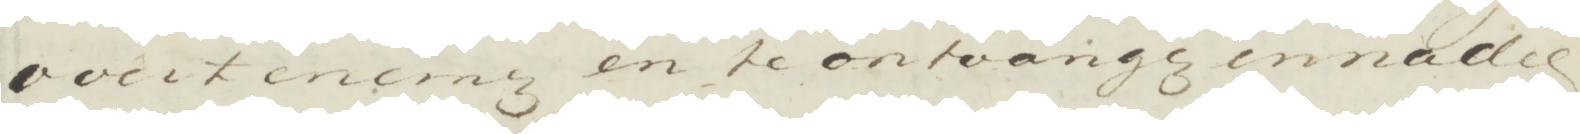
over te nemen en te ontvangen en nadee
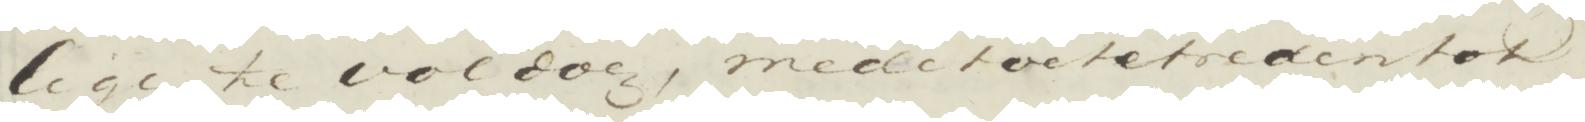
lige te voldoen, mede toe te treden tot
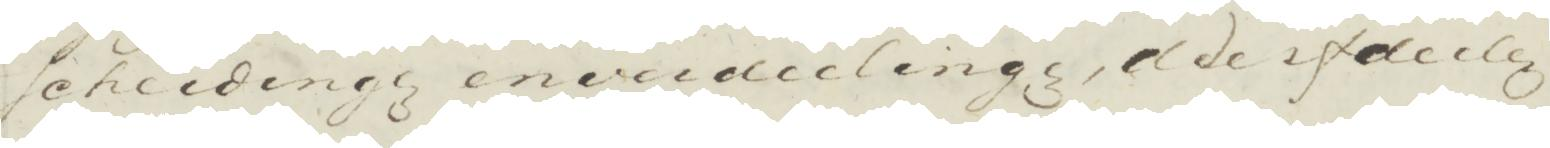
scheidingen en verdeelingen, de erfdelen
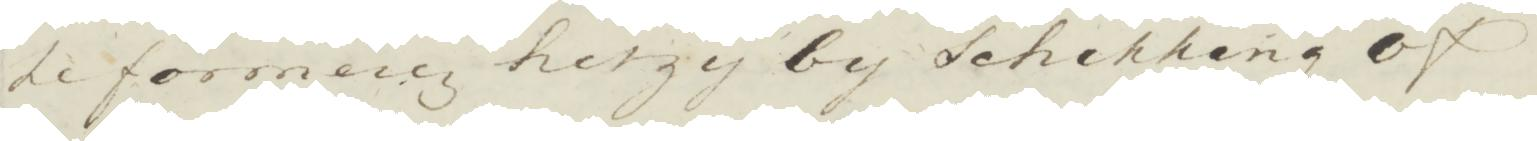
te formeren hetzy by schikking of
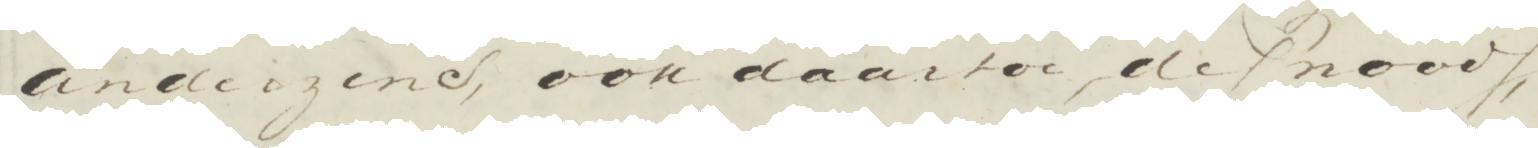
anderzins, ook daar toe, desnoods,
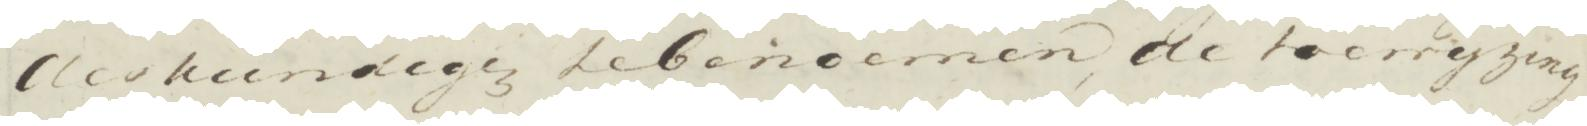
deskundigen te benoemen, de toewyzing
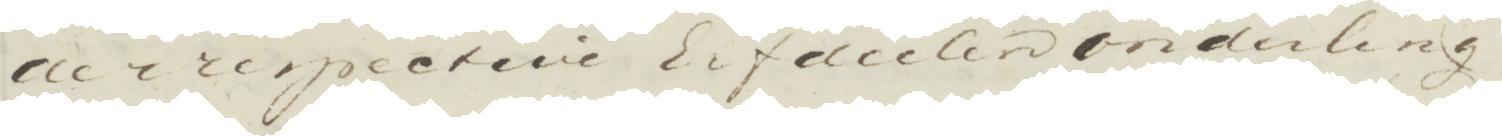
der respective Erfdeelen onderling
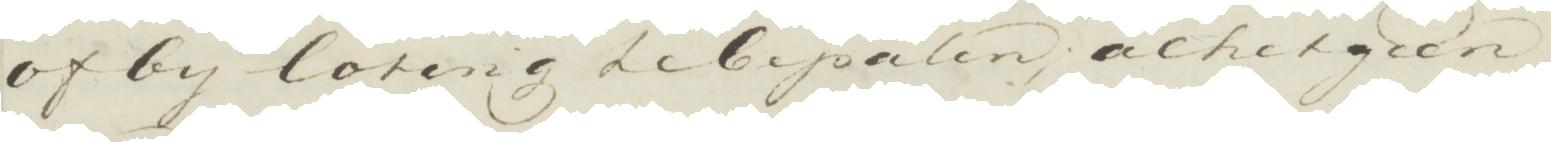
of by loting te bepalen, al hetgeen
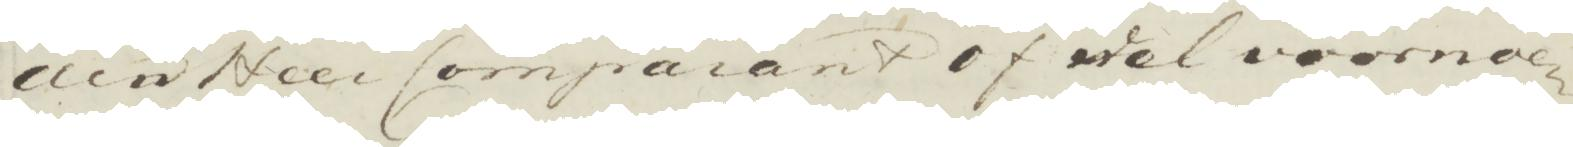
den Heer Comparant of wel voornoem,
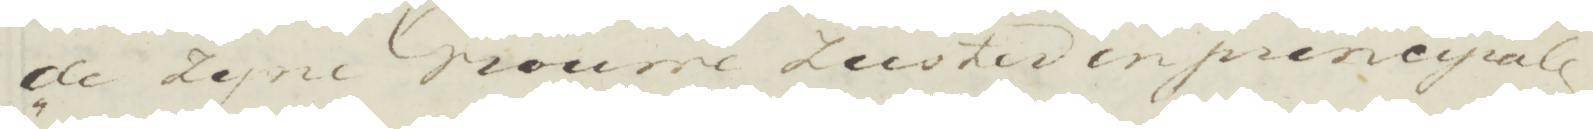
„de zyne vrouwe zuster in principale
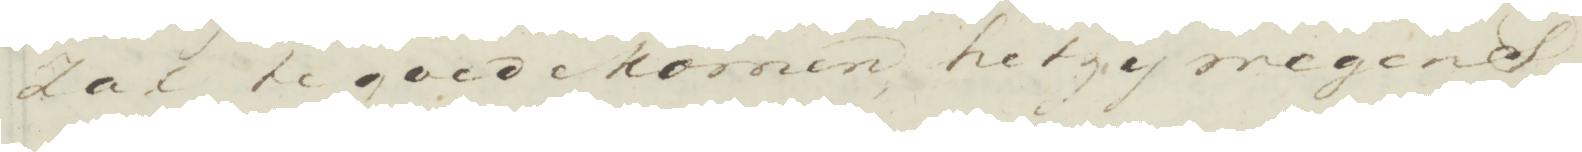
zal te goede komen, hetzy wegens
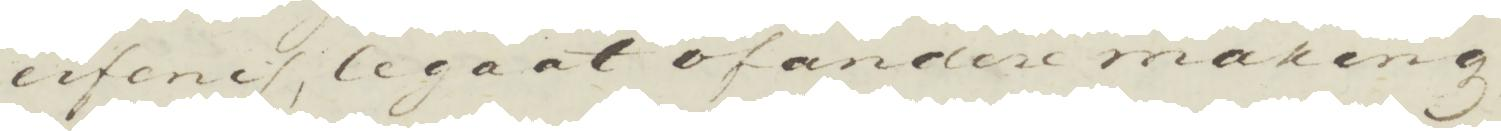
erfenis, legaat of andere making,
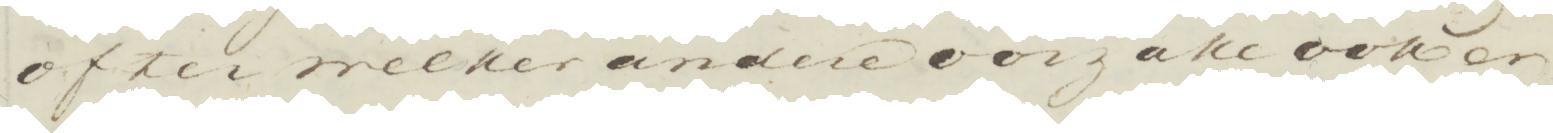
of ter welker andere oorzake ook en
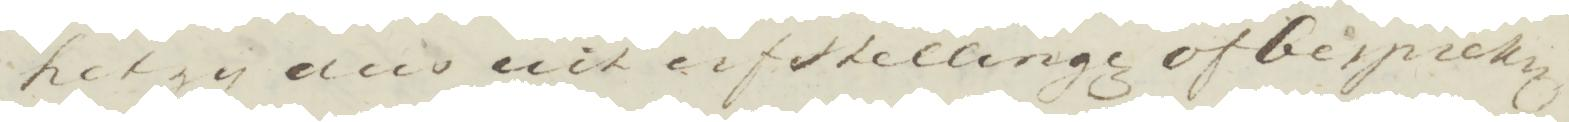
hetzy dus uit erfstellinge of besprekin
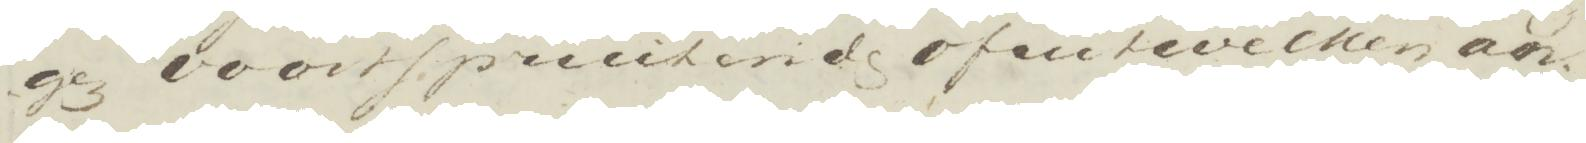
,gen voortspruitende of uit welken an„
